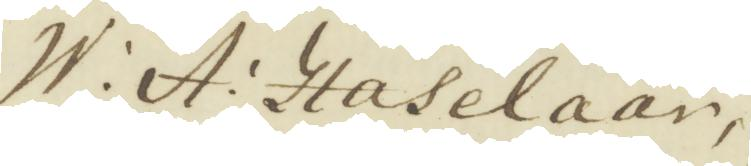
W:A: Haselaar,
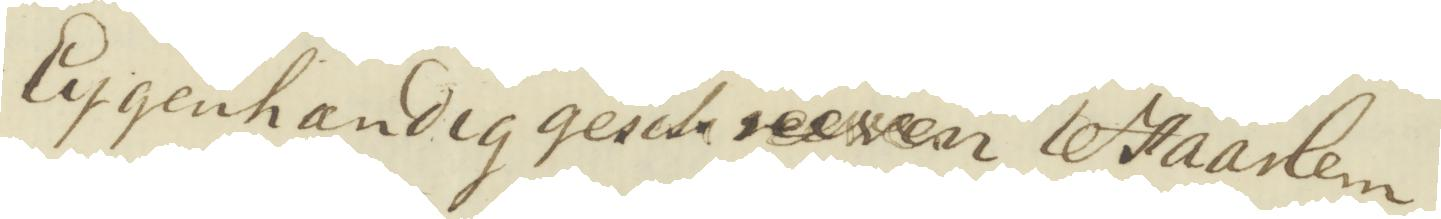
Eygenhandig geschreeven te Haarlem
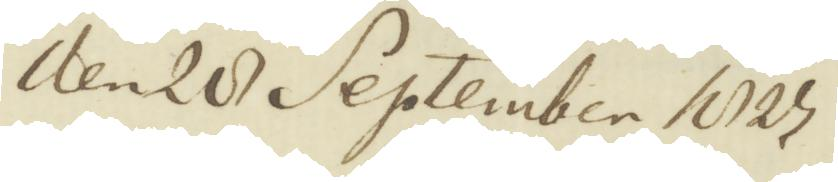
den 28 September 1827
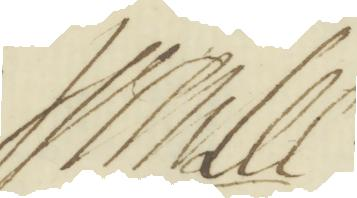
JVMill
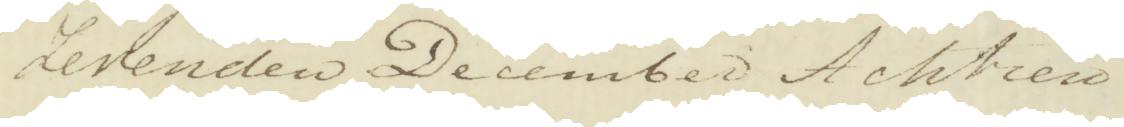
zevenden December Achtien
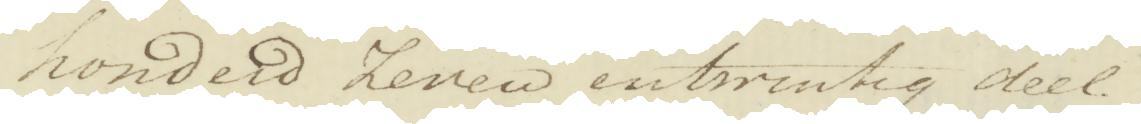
honderd zeven en twintig deel
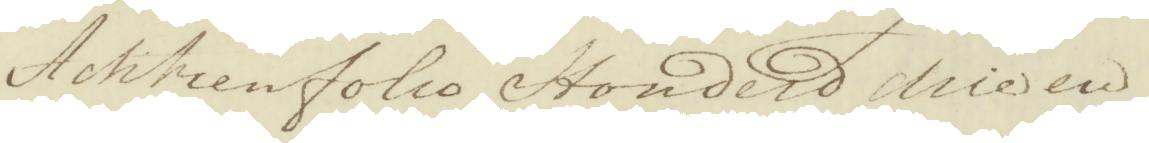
Achtien folio Honderd drie en
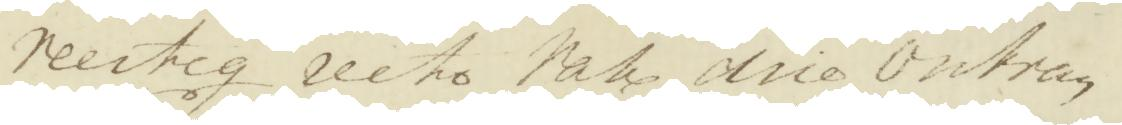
veertig recto vak drie ontvan
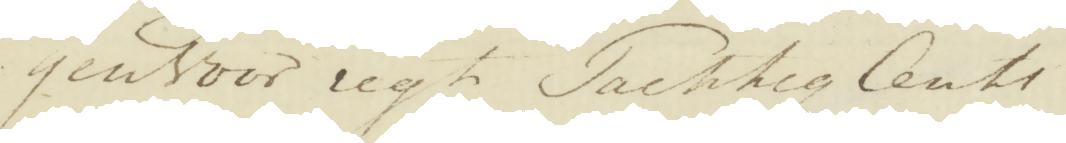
gen voor regt Tachtig Cents
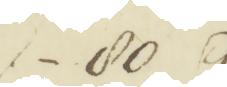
1-. 80
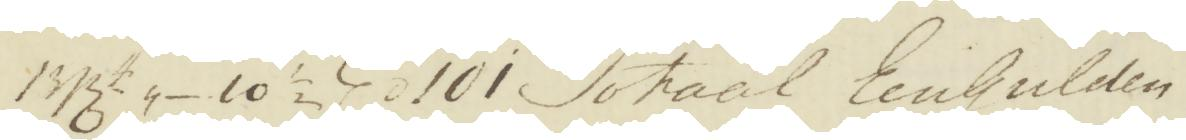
13pr=t „-. 10½ 101 Totaal Een Gulden
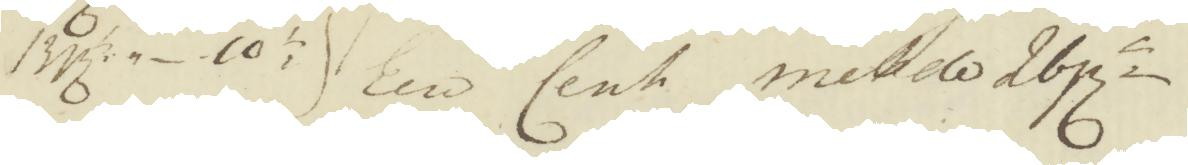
13pr=t „-. 10½ Een Cents mede 26pr=t ½
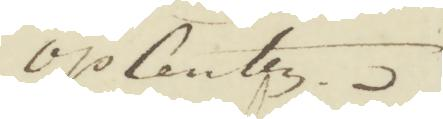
op Centen.
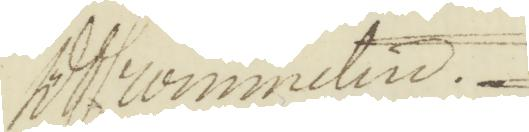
D.J. Crommelin.
